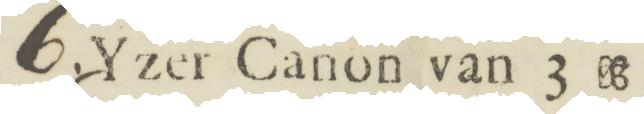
6. Yzer Canon van 3 lb
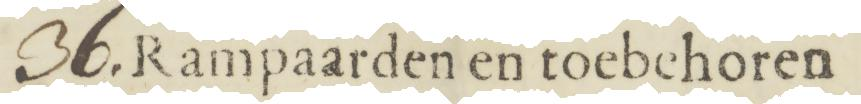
36. Rampaarden en toebehoren
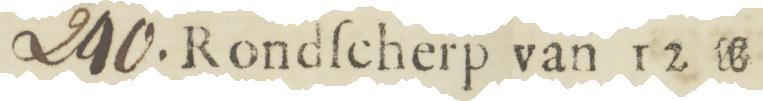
240. Rondscherp van 12 lb
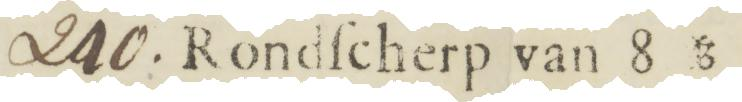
240. Rondscherp van 8 lb
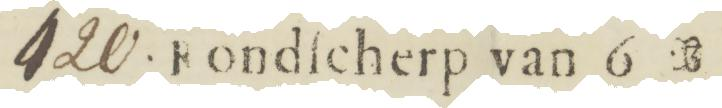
420. Rondscherp van 6 lb
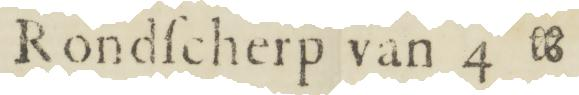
—. Rondscherp van 4 lb
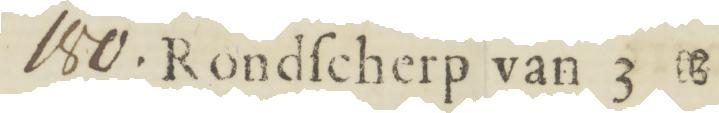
180. Rondscherp van 3 lb
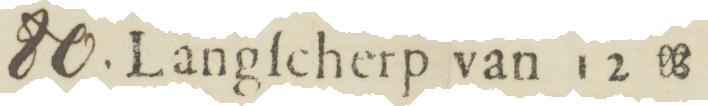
80. Langscherp van 12 lb
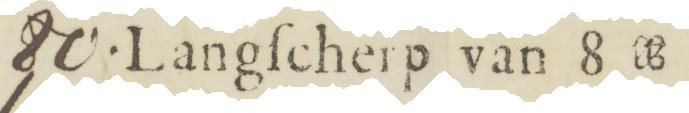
80. Langscherp van 8 lb
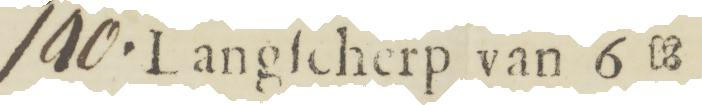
140. Langscherp van 6 lb
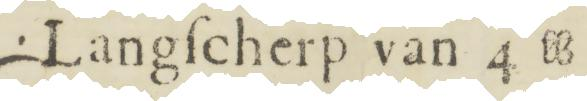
—. Langscherp van 4 lb
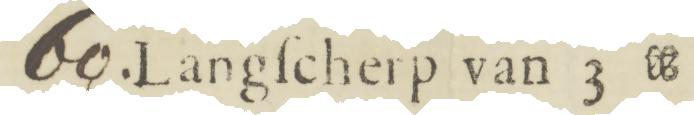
60. Langscherp van 3 lb
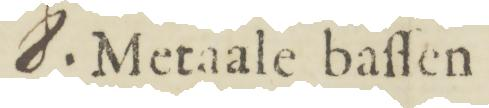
8. Metaale bassen
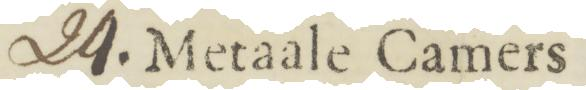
24. Metaale Camers
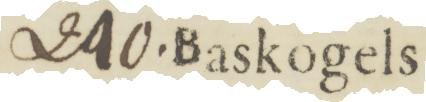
240. Baskogels
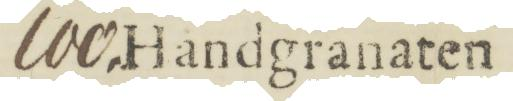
100. Handgranaten
